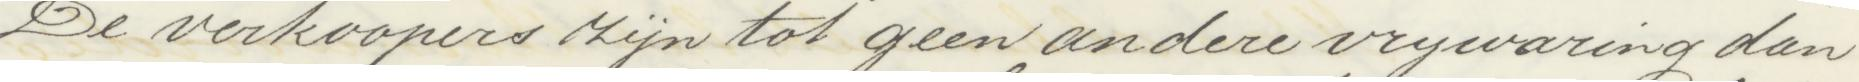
De verkoopers zijn tot geen andere vrijwaring dan
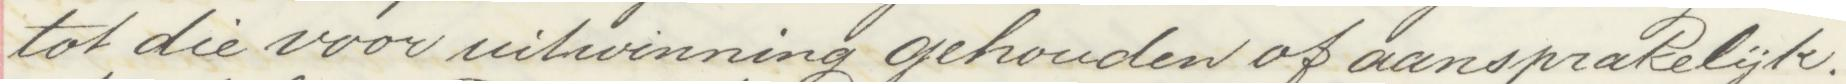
tot die voor uitwinning gehouden of aansprakelijk.
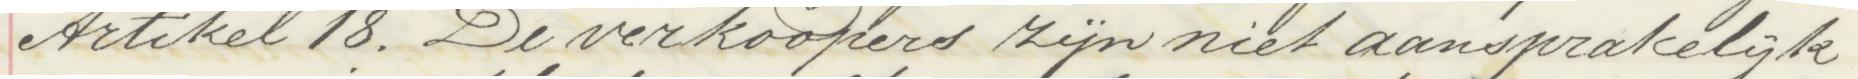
Artikel 18. De verkoopers zijn niet aansprakelijk
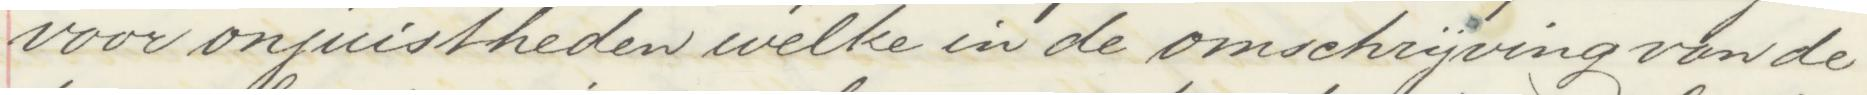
voor onjuistheden welke in de omschrijving van de
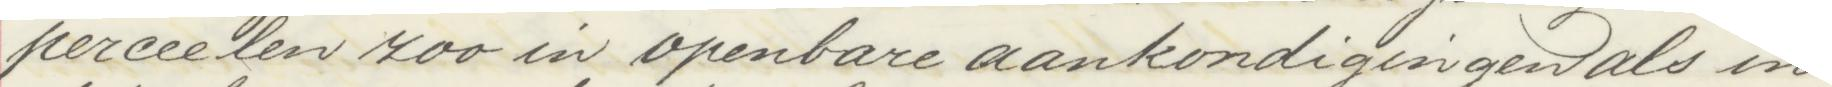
perceelen zoo in openbare aankondigingen als in
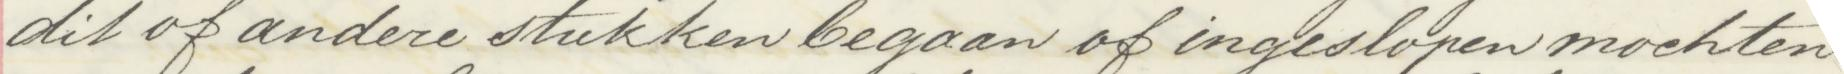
dit of andere stukken begaan of ingeslopen mochten
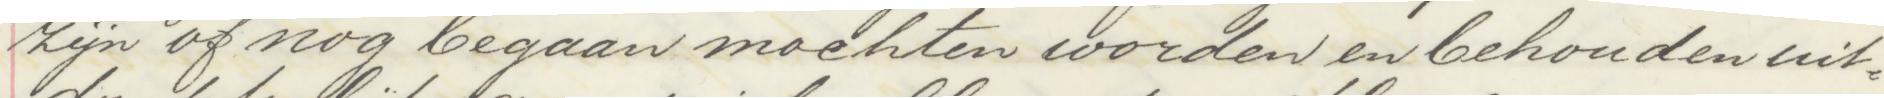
zijn of nog begaan mochten worden en behouden uit„
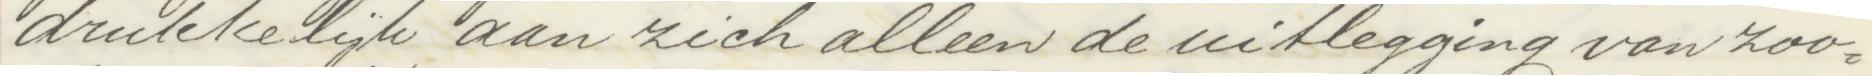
drukkelijk aan zich alleen de uitlegging van zoo„
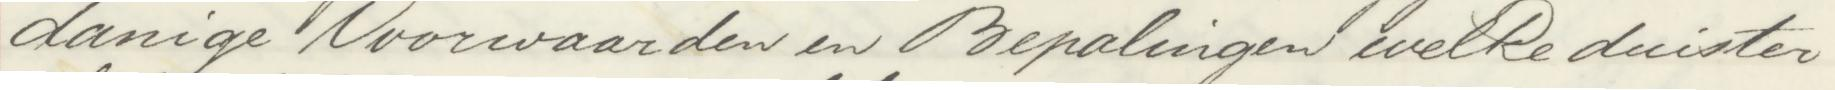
danige Voorwaarden en Bepalingen welke duister
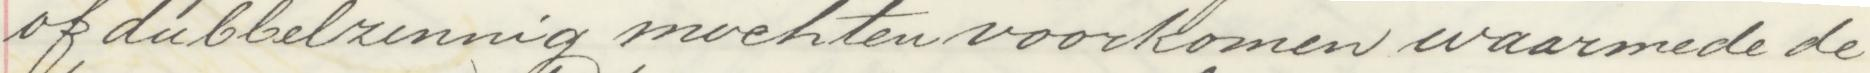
of dubbelzinnig mochten voorkomen waarmede de
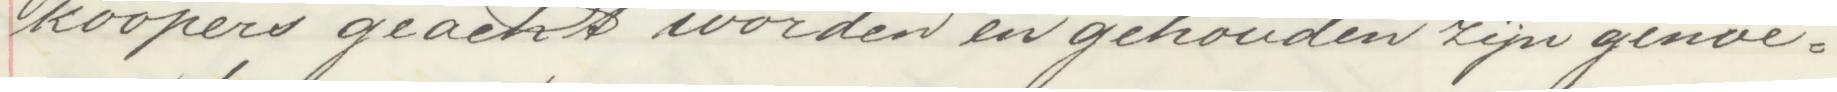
koopers geacht worden en gehouden zijn genoe=
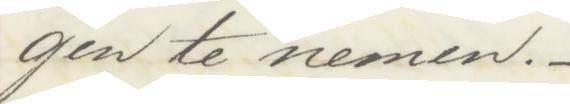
gen te nemen.-
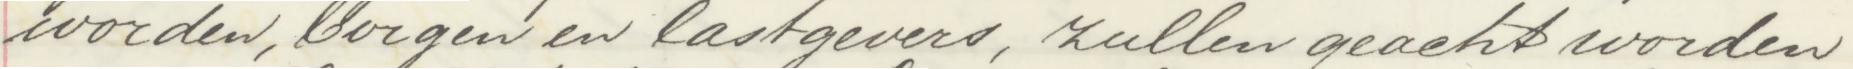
worden, borgen en lastgevers, zullen geacht worden
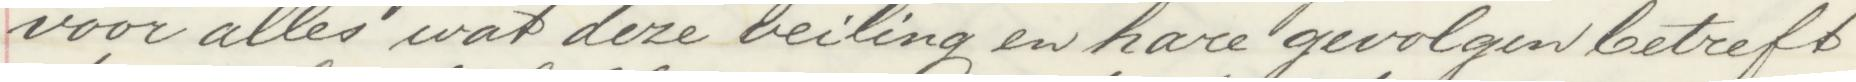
voor alles wat deze veiling en hare gevolgen betreft
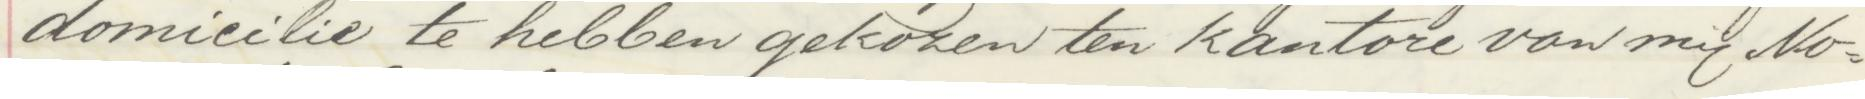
domicilie te hebben gekozen ten kantore van mij No=
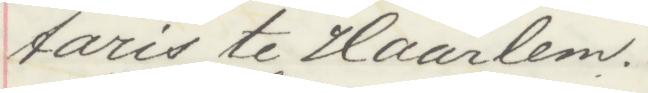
taris te Haarlem.
